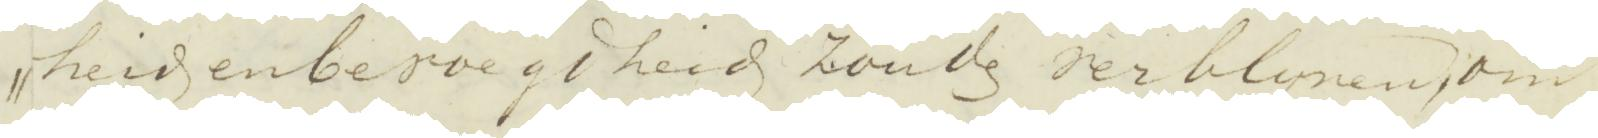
„heid en bevoegdheid zouden verblyven, om
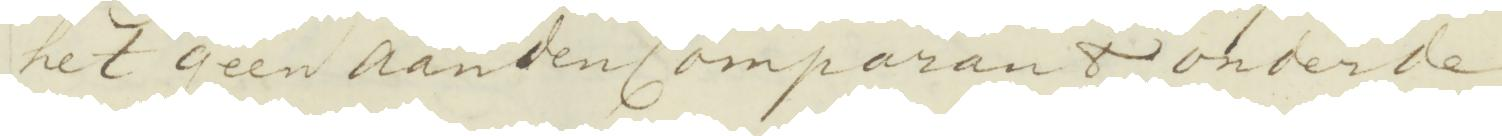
het geen aan den Comparant onder de
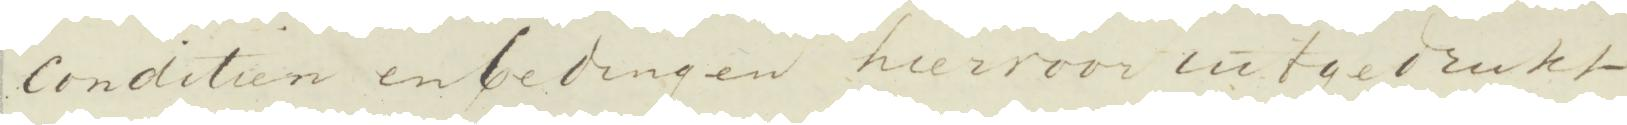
conditien en bedingen hiervoor uitgedrukt
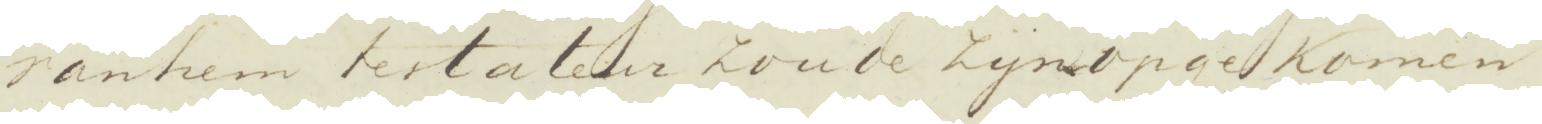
van hem testateur zoude zijn opgekomen
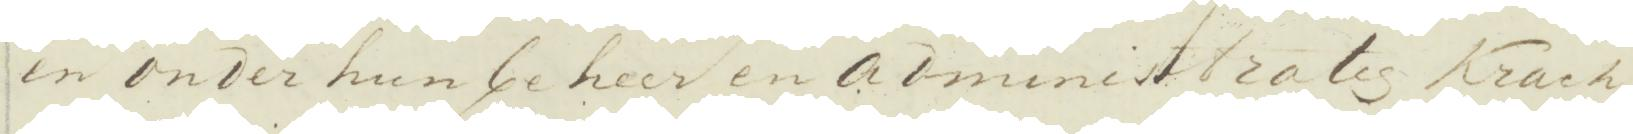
en onder hun beheer en Administratie krach
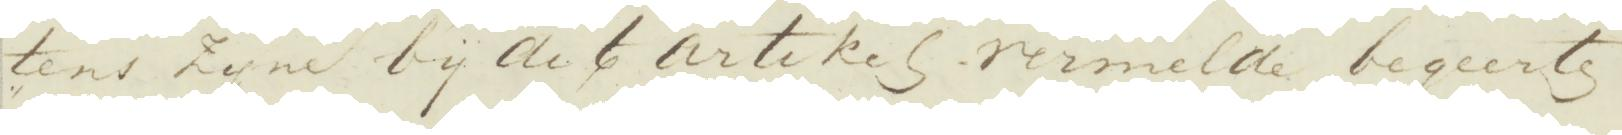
„tens zyne bij dit artikel vermelde begeerte
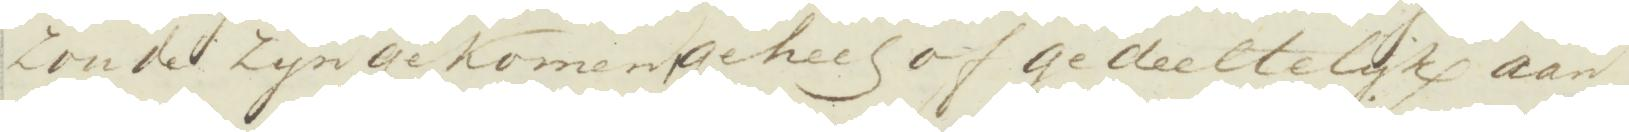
zoude zyn gekomen, geheel of gedeeltelijk aan
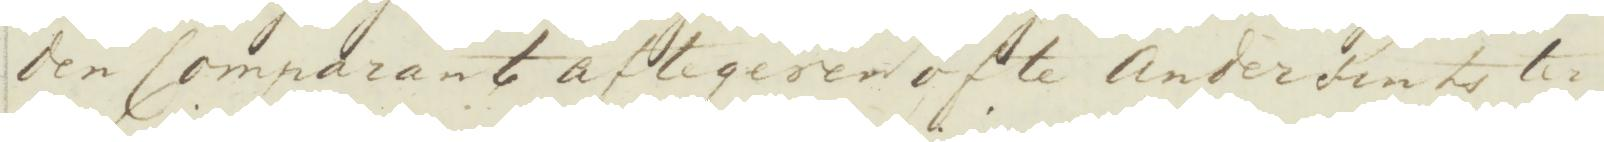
den Comparant aftegeven of te Andersints ter
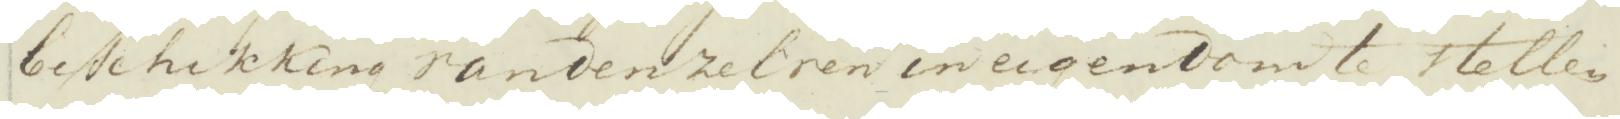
beschikking van denzelven in eigendom te stellen
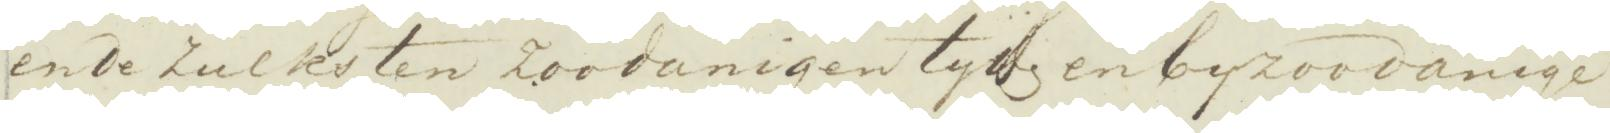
ende zulks ten zoodanigen tyde en by zoodanige
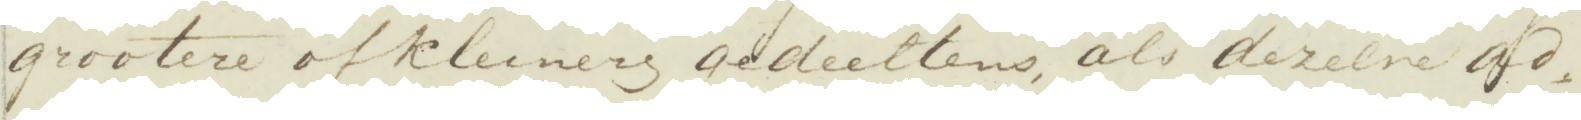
grootere of kleinere gedeeltens, als dezelve ad„
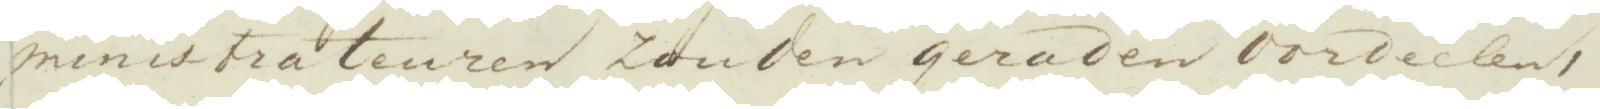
ministrateuren zouden geraden oordeelen,
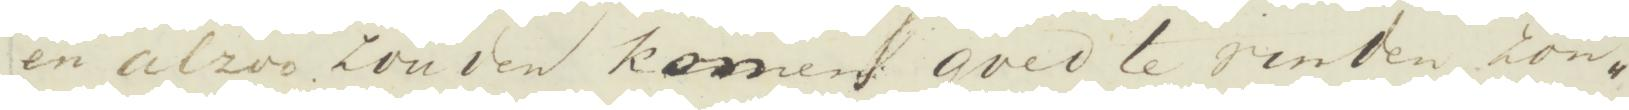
en alzoo zouden komen goed te vinden zon„
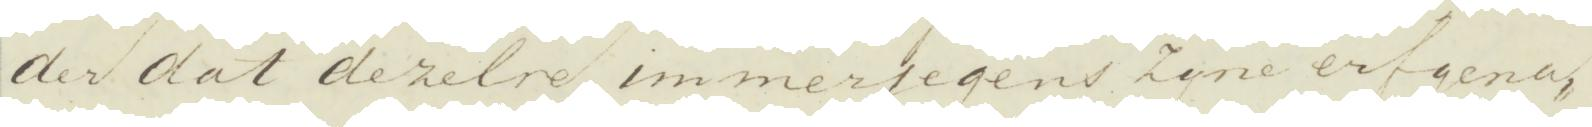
der dat dezelve immer jegens zijne erfgena„
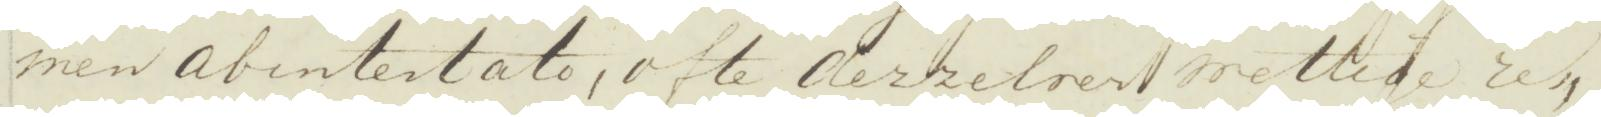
men abintestato, ofte derzelver wettige re„
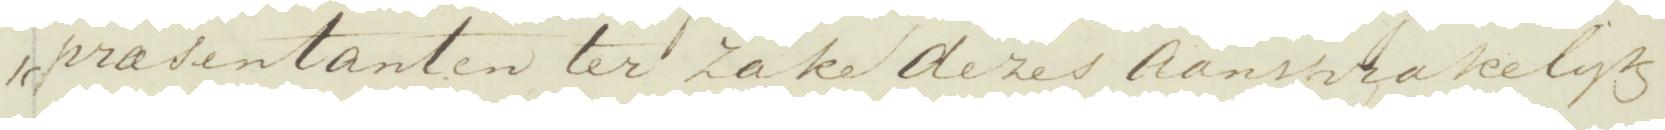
„praesentanten ter zake dezes aansprakeljk
